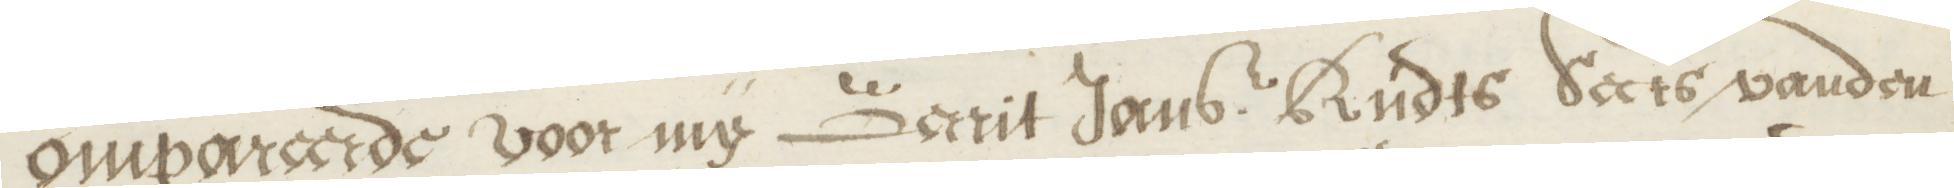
Compareerde voor mij Gerrit Ians.n Rudts secrs vanden
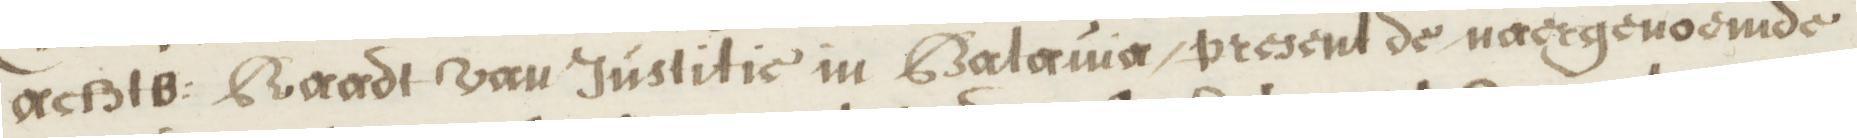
achtb: Raadt van Iustitie in Batavia present de naergenoemde
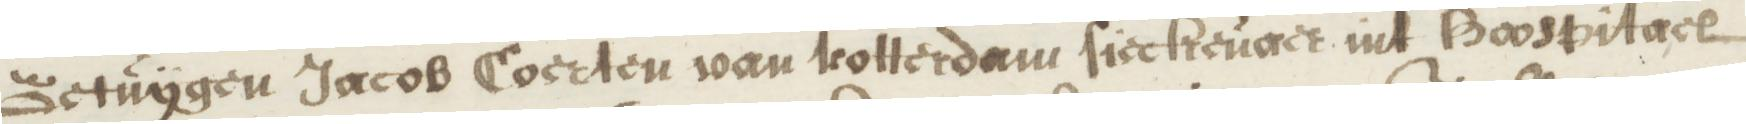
Getuijgen Iacob Coerten van rotterdam sieckenaer int hoospitael
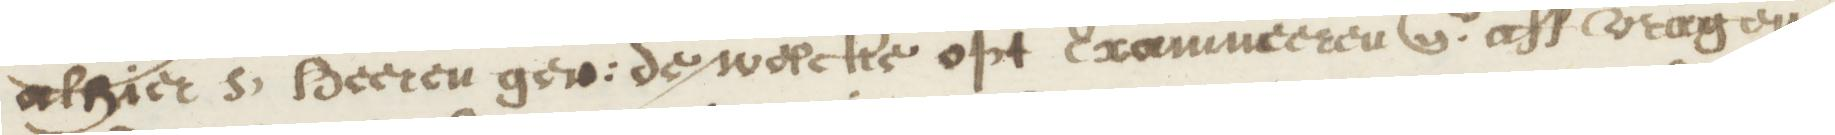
alhier d' Heeren gev: de welcke opt Examineeren ende aff vragen
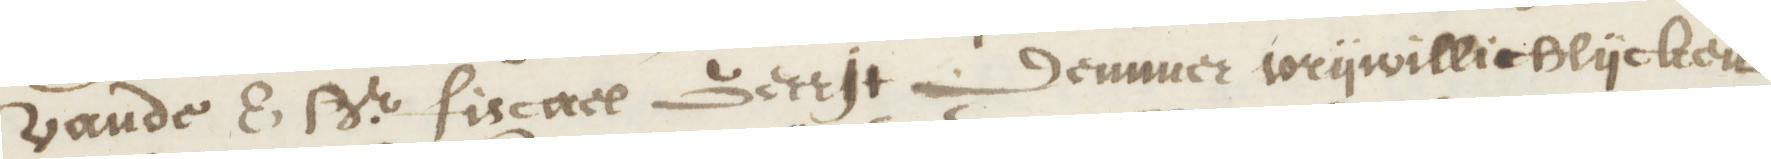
vande E H.r fiscael Gerrit demmer vrijwillichlijcken
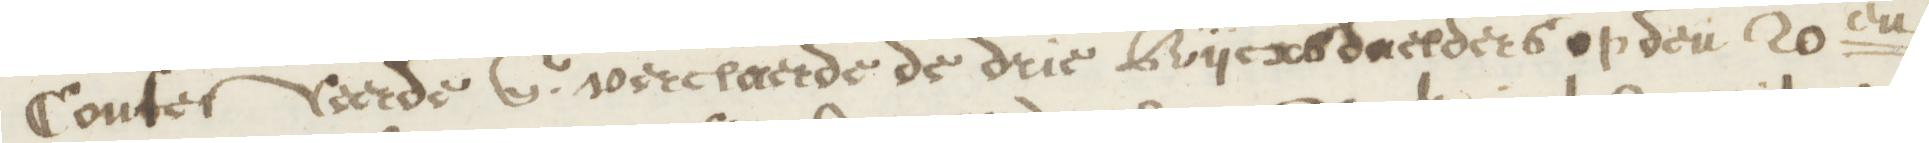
Contesteerde ende verclaerde de drie Rijcxsdaelders op den 20=en
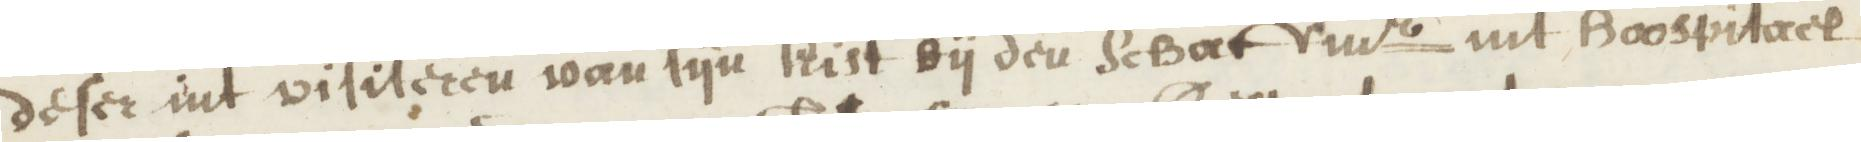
deser int visiteren van sijn kist bij den schattm=r int hoospitael
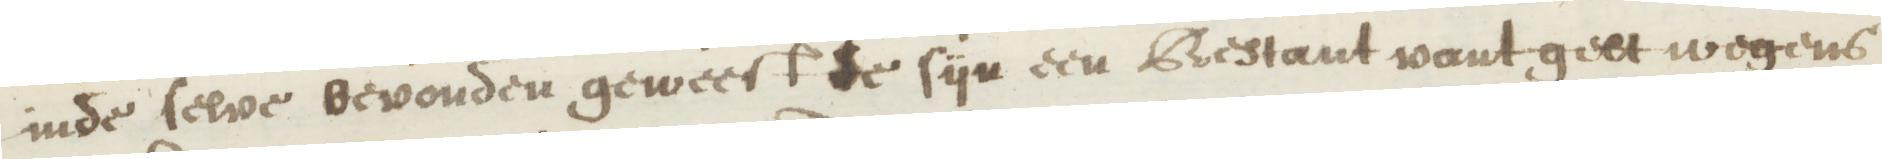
inde selve bevonden geweest te sijn een Bestant vant gelt wegens
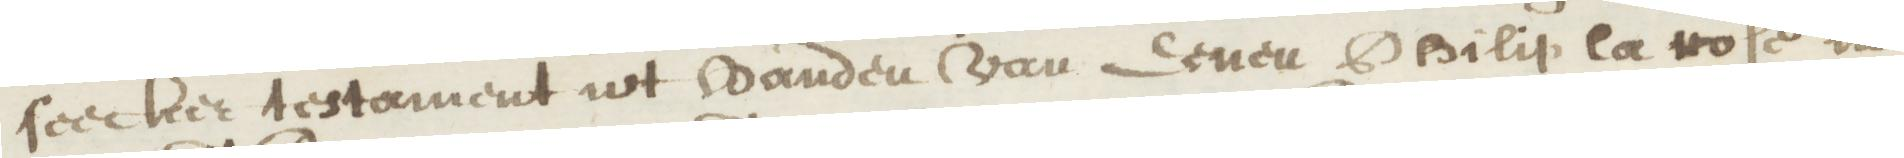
seecker testament uit handen van Eenen Philip la rose in
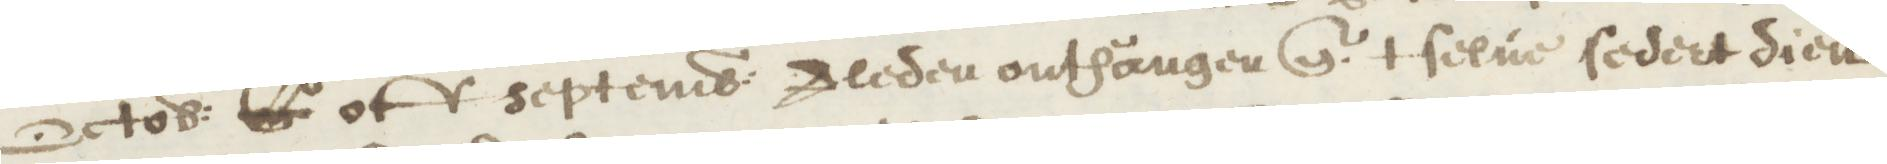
Octob: ende off septemb: verleden ontfanger ende tselve sedert dien
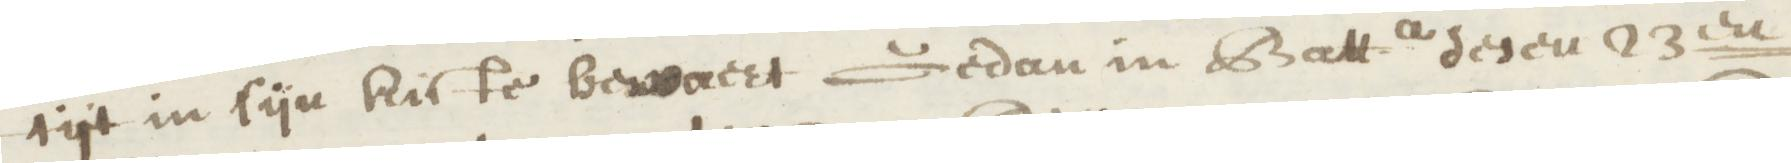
tijt in sijn kiste bewaert Gedan in Batt-a deten 23=en
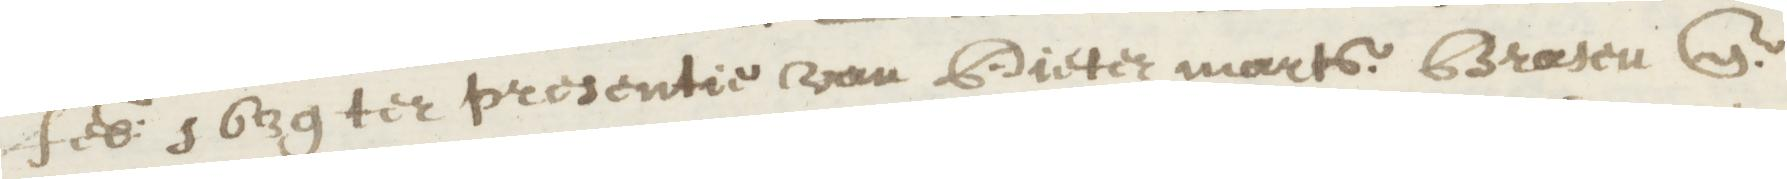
feb: 1639 ter presentie van Pieter marts. Braten ende
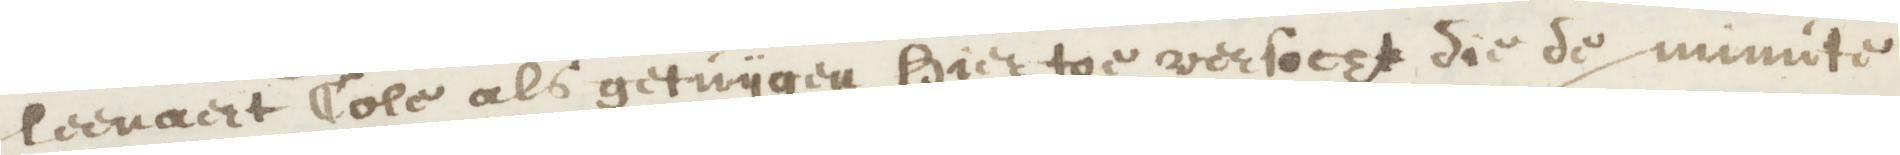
leenaert Cole als getuijgen hier toe versocht die de minute
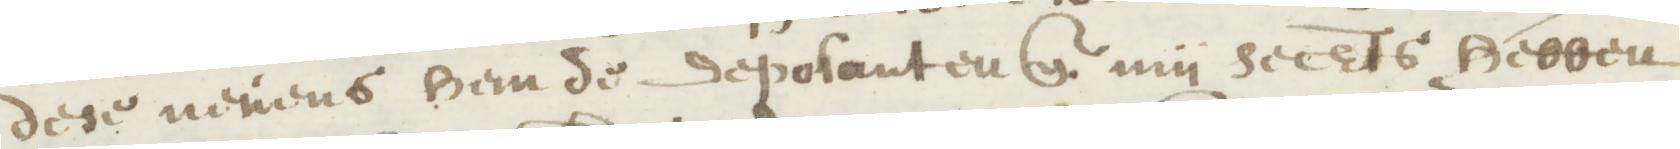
dese nevens hem de deposanten ende mij secrts hebben
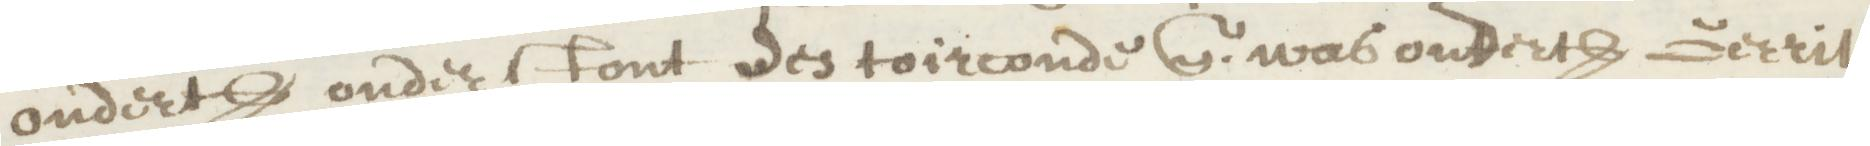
ondert onderstont des toirconde ende was ondert Gerrit
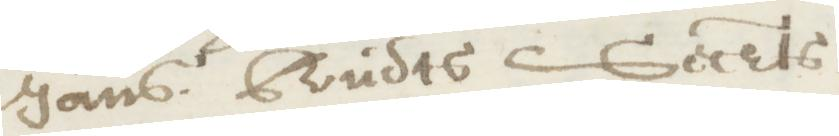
Jans. Rudts Secrts
